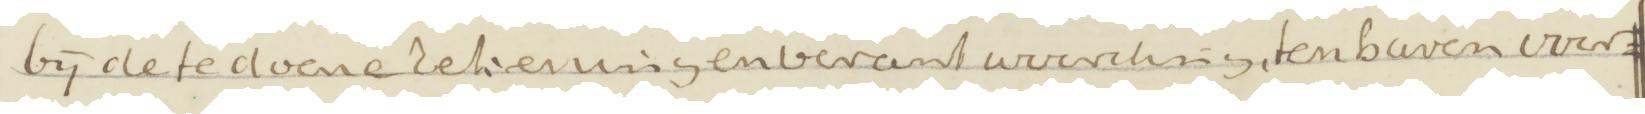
bij de te doene rekening en verantwoording ten haren voor=
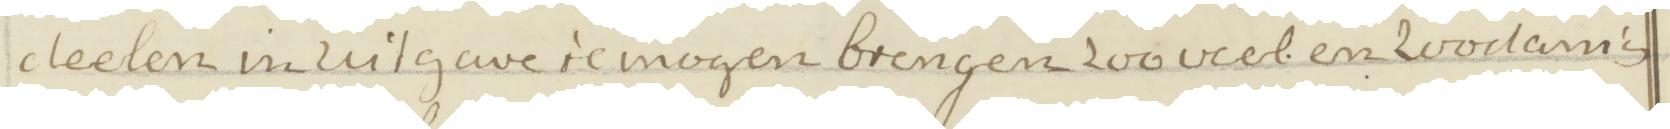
deelen in uitgave te mogen brengen zoo veel en zoodanig
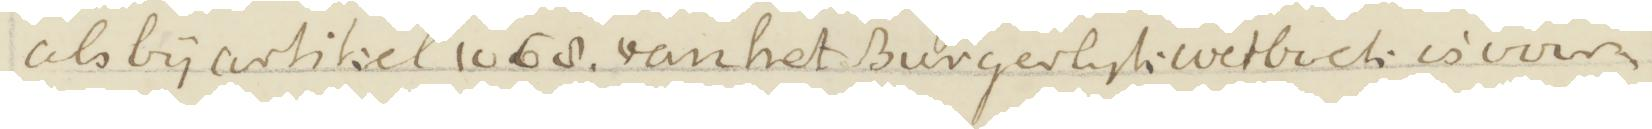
als bij artikel 1068 van het Burgerlyk wetboek is voor-
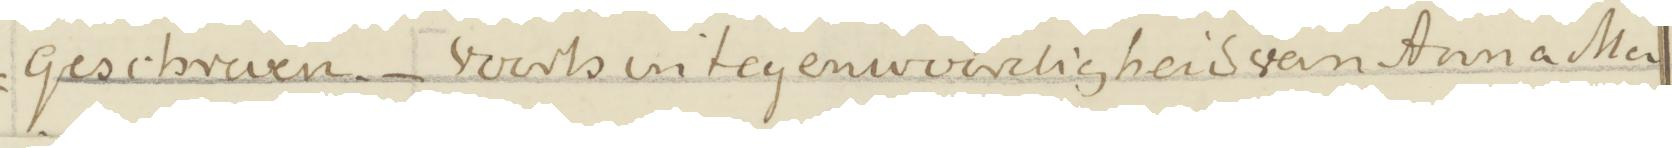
=geschreven.- voorts in tegenwoordigheid van Anna Ma
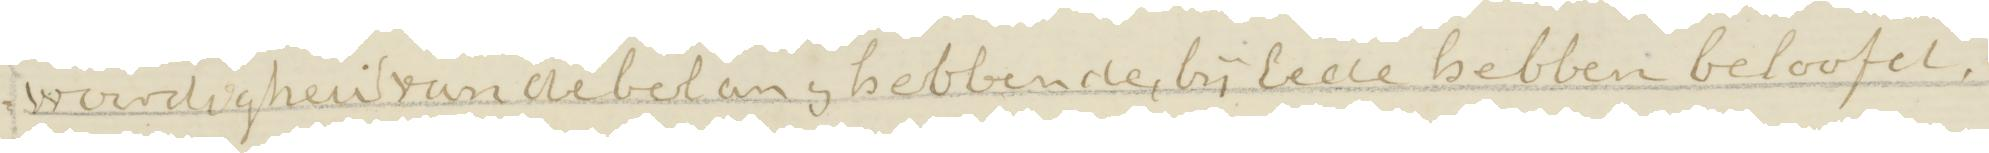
woordigheid van de belang hebbende, bij Eede hebben beloofd
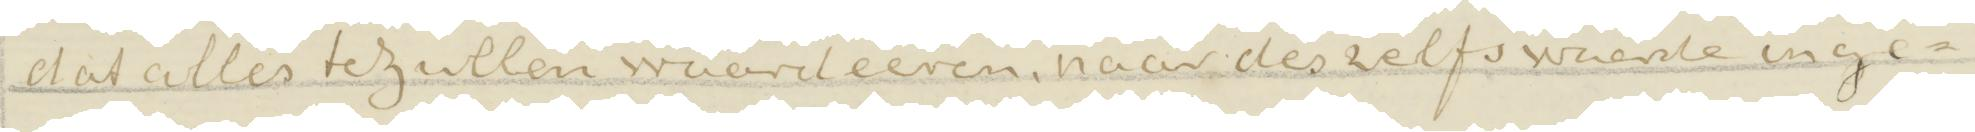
dat alles te zullen waardeeren naar des zelfs waarde inge=
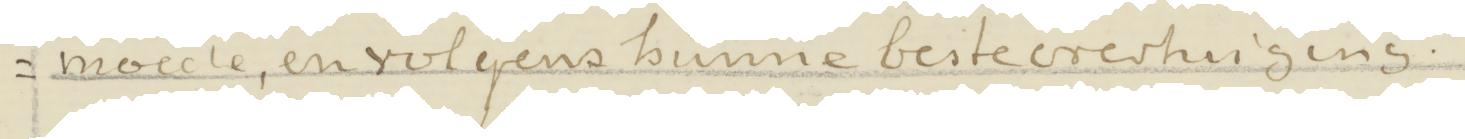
=moede, en volgens hunne beste overtuiging
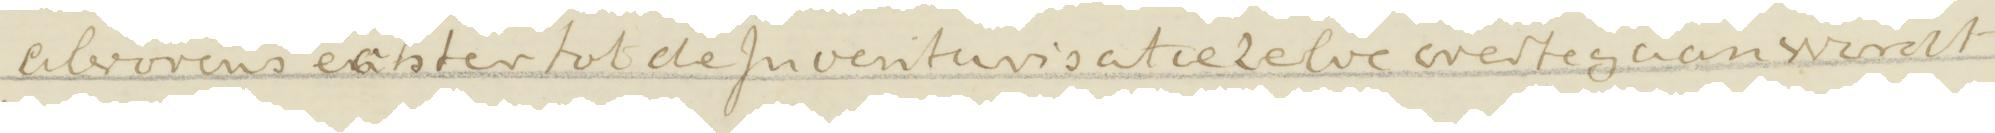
alvorens echter tot de Jnventarisatie zelve over te gaan wordt
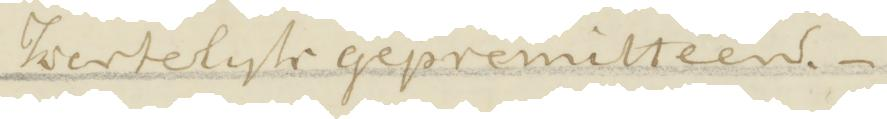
Kortelyk gepremitteerd.-
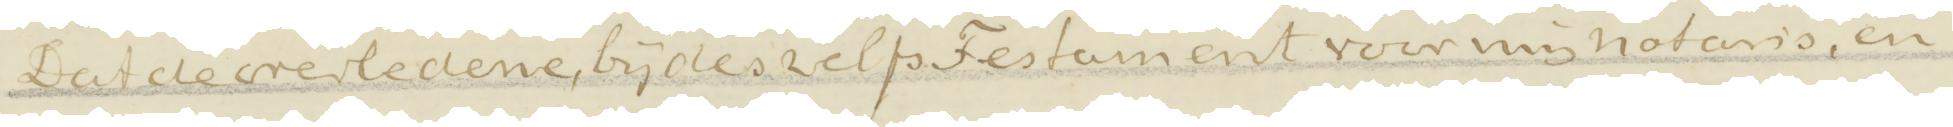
Dat de overledene bij deszelfs Testament voor mij notaris en
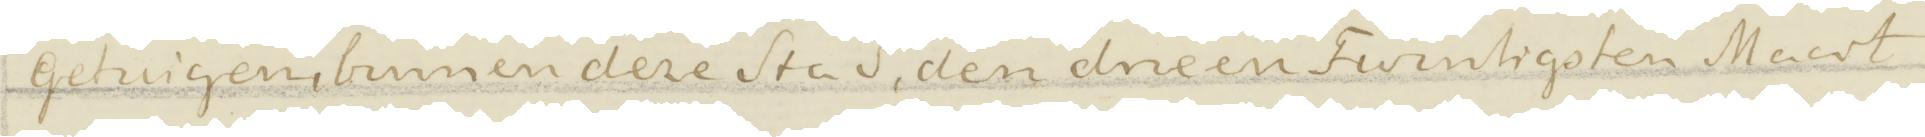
getuigen binnen deze stad, den drie en Twintigsten Maart
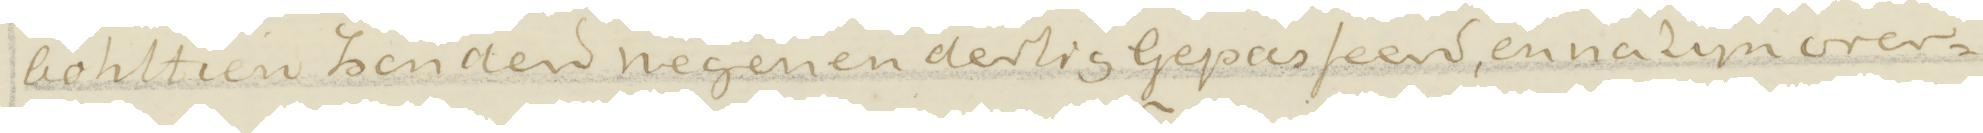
Achttien honderd negen en dertig Gepasseerd en na zyn over=
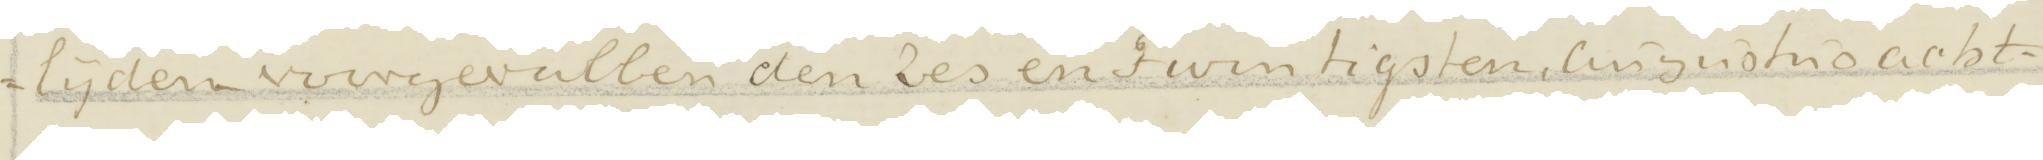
=lijden voorgevallen den zes en Twintigsten augustus acht=
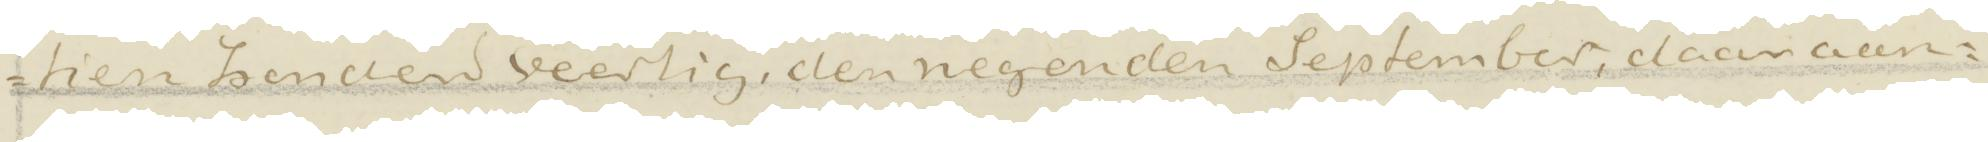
=tien honderd veertig, den negen den September daar aan=
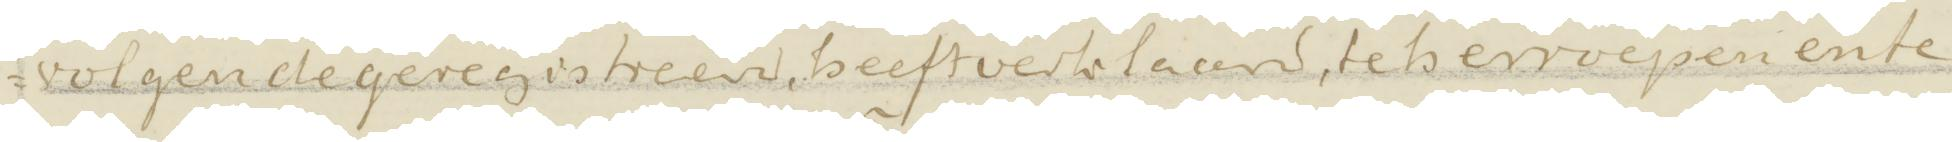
=volgen de geregistreerd, heeft verklaard, te herroepen en te
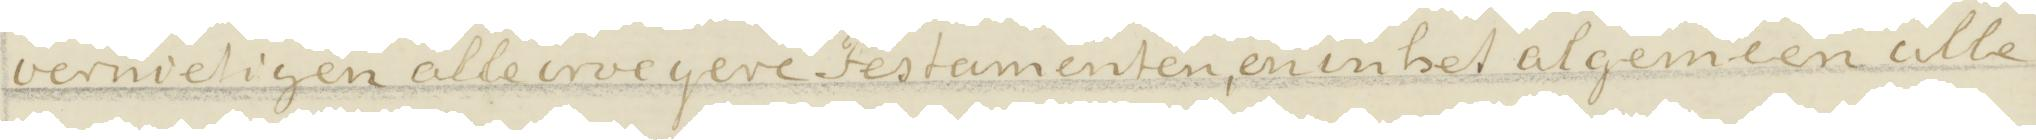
vernietigen alle vroegere Testamenten, en in het algemeen alle
